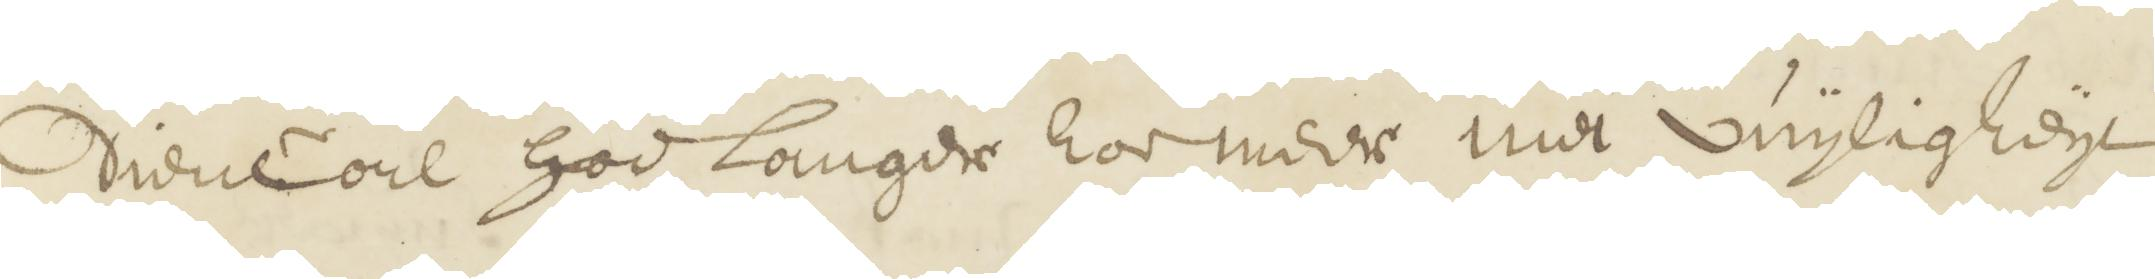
dien corl goelanger hoe meer met vuijligheijt
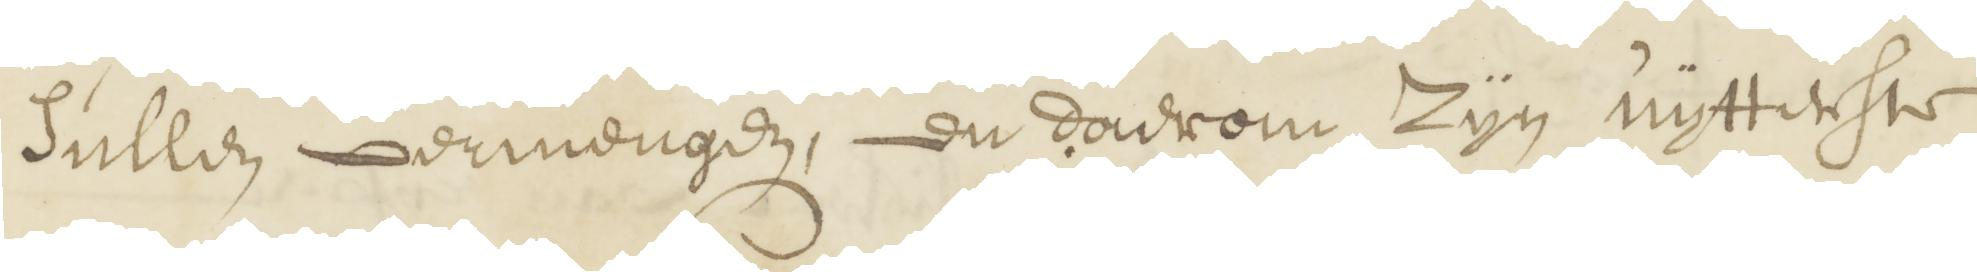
sullen vermengen, en daerom zijn uijtterste
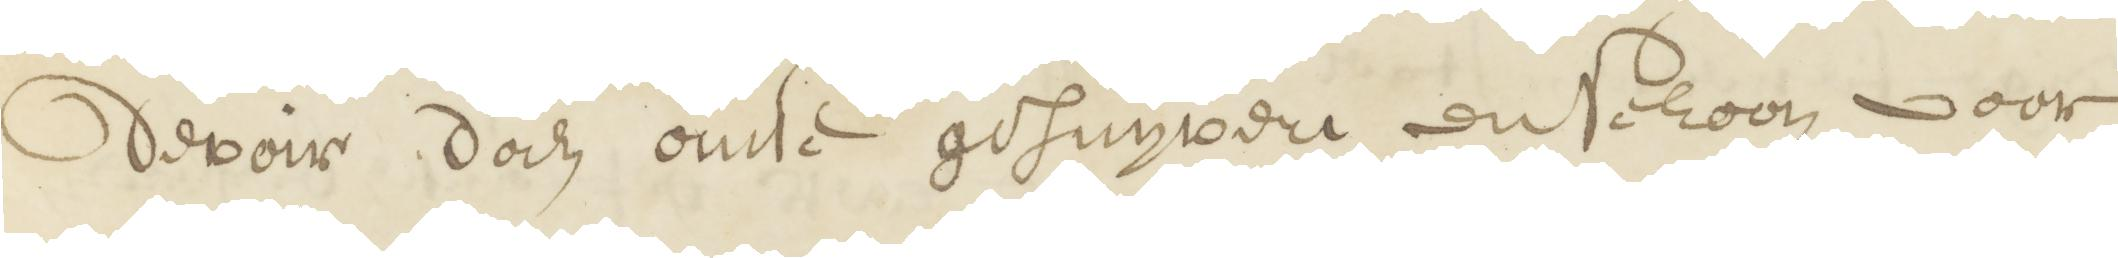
devoir doen omse gesuijvert en schoon voor
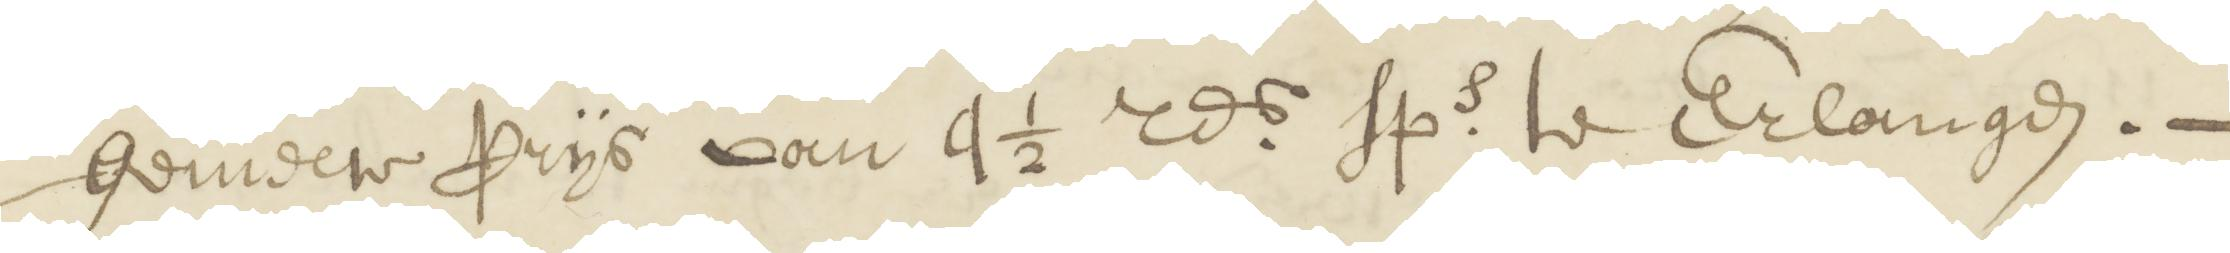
gemelte prijs van 4½ rd.s sp.s te Erlangen.
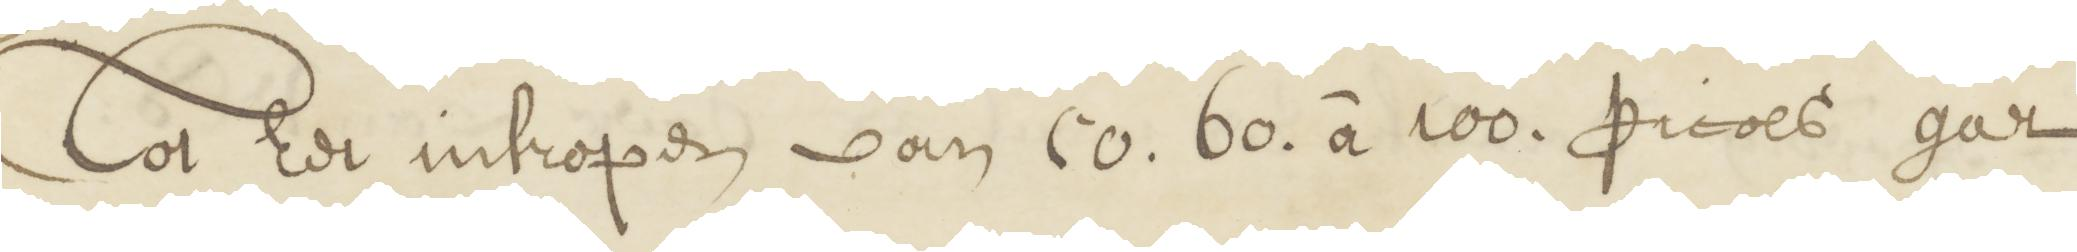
Tot het inkopen van 50. 60. â 100. picols goet
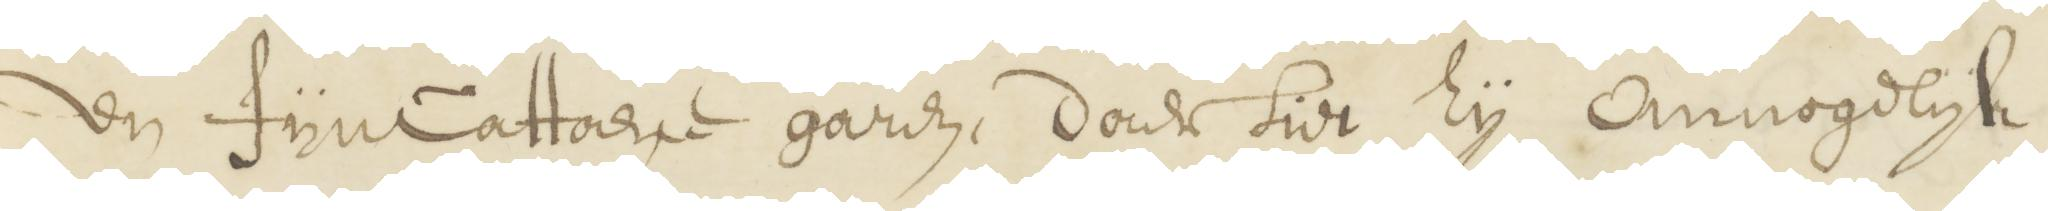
en fijn Cattoene garen, daer siet hij onmogelijk
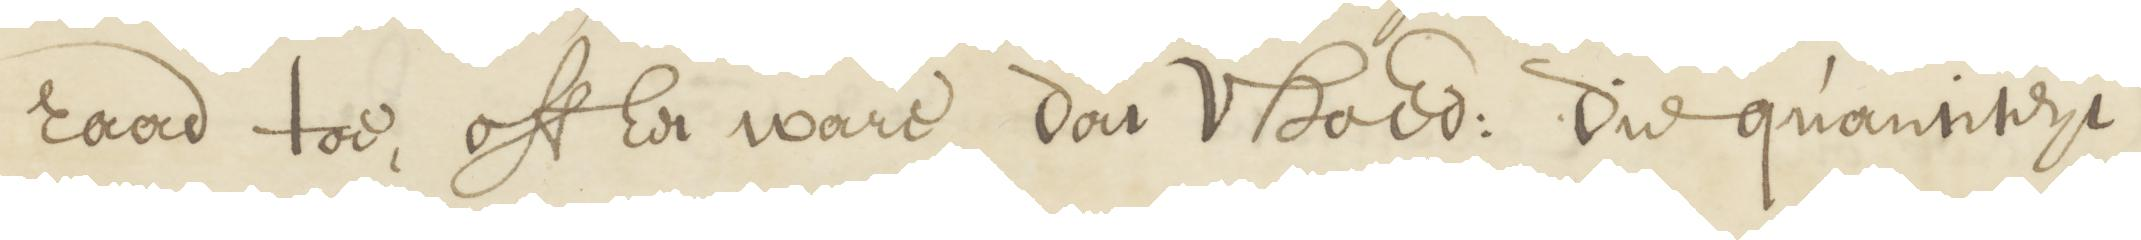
raad toe, off het ware dat VHoEd: die quantiteijt
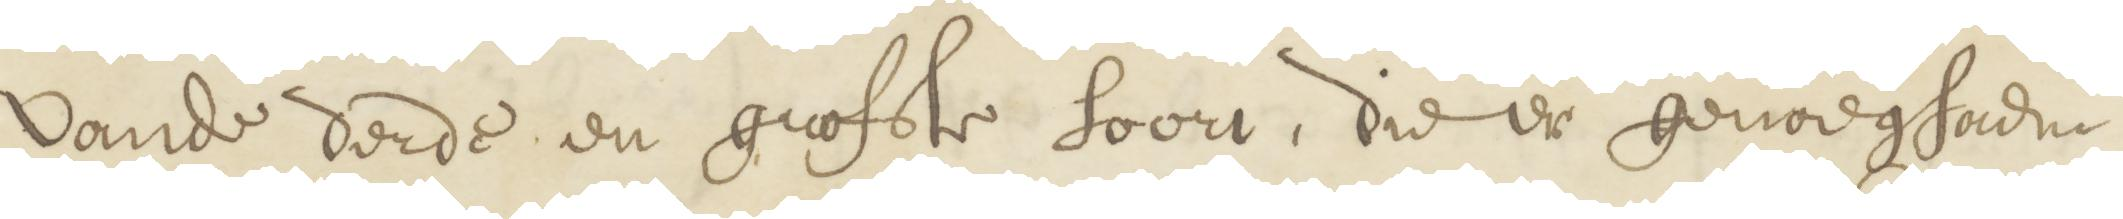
vande derde en grofste soort, die 'er genoegsaem
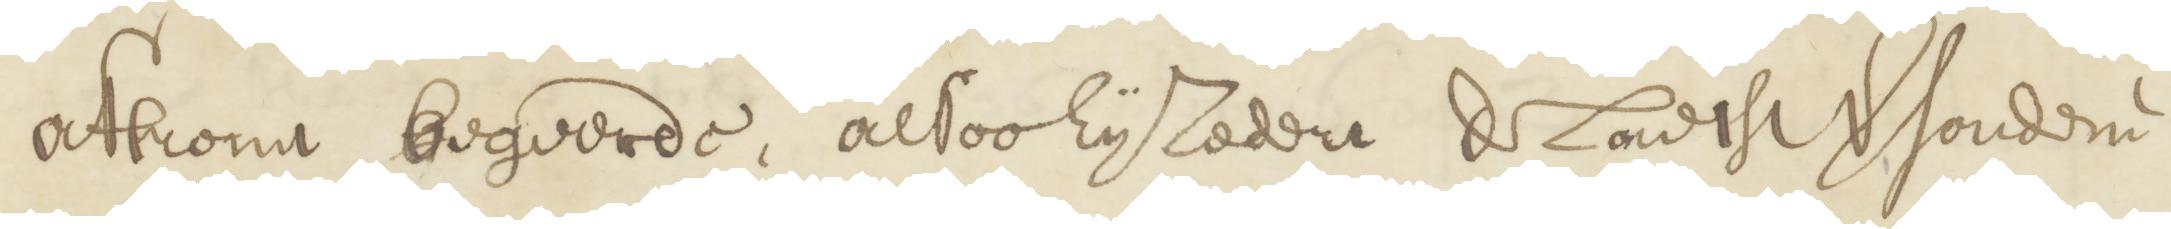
afkomt begeerde, alsoo hij zedert de laetst versondene
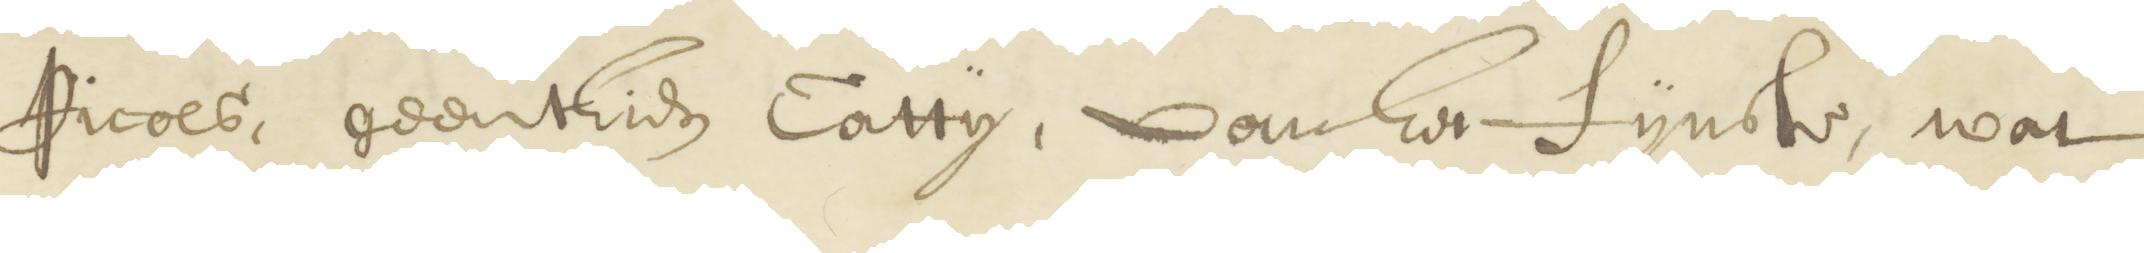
picols, geen thien Cattij, van het fijnste, wat
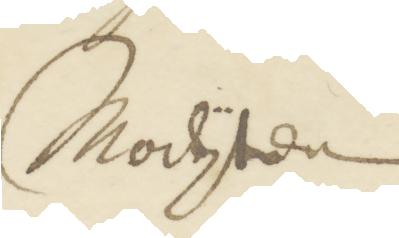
Moeijten
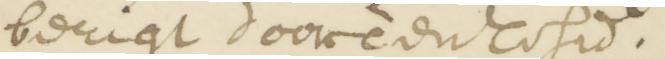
berigt door een resid.t
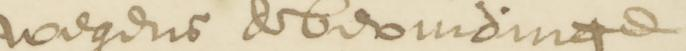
wegens de bevindinge
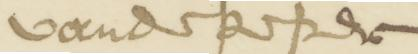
van de peper
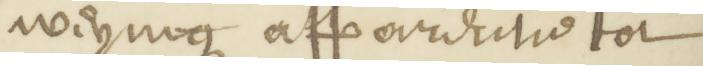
weijnig apparentie tot
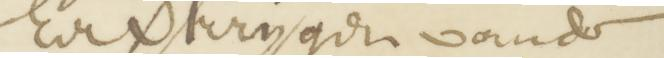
het verkrijgen vande
